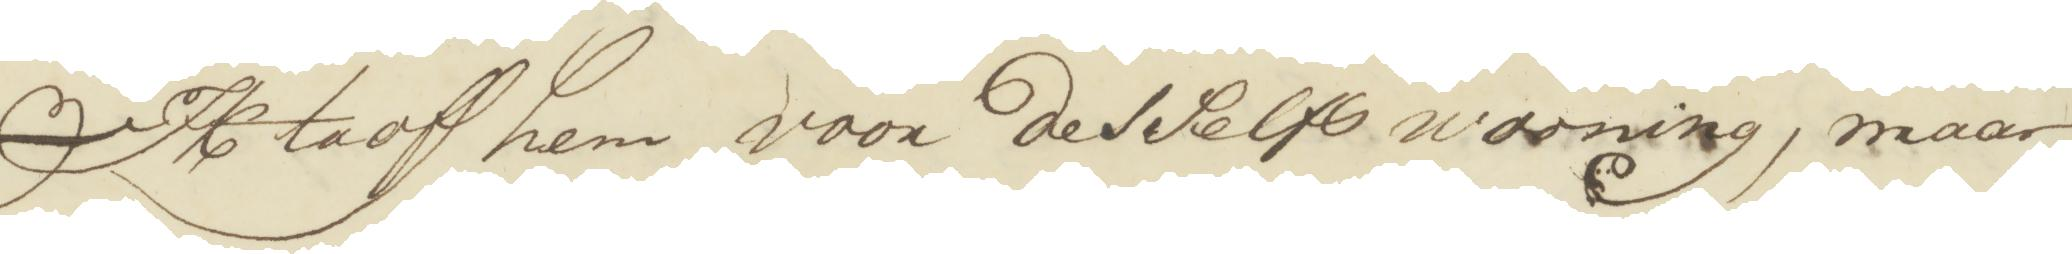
Ik troff hem voor desselfs wooning, maar
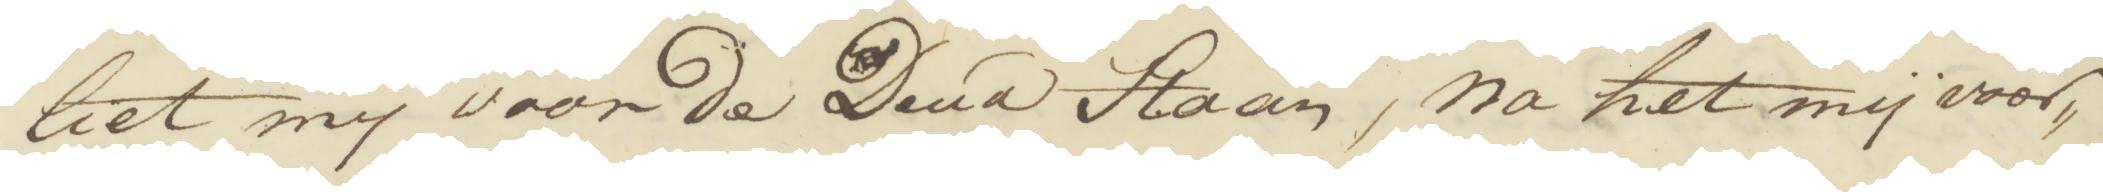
liet mij voor de Deur staan, na het mij voor„
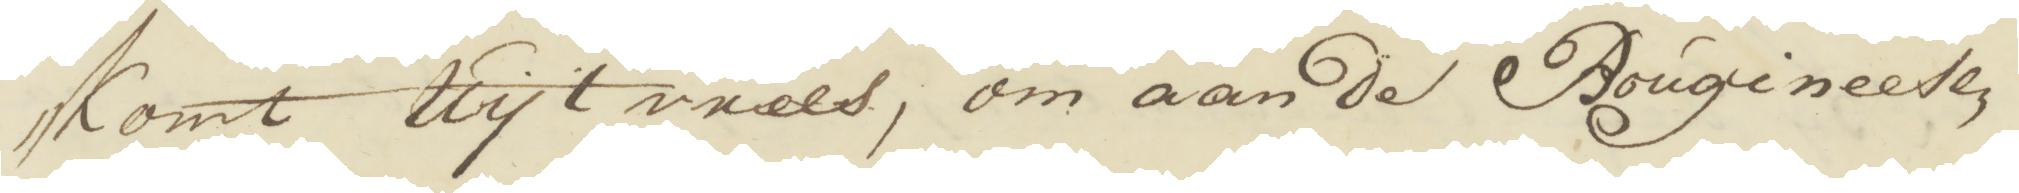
„komt uijt vrees, om aan de Bougineesen
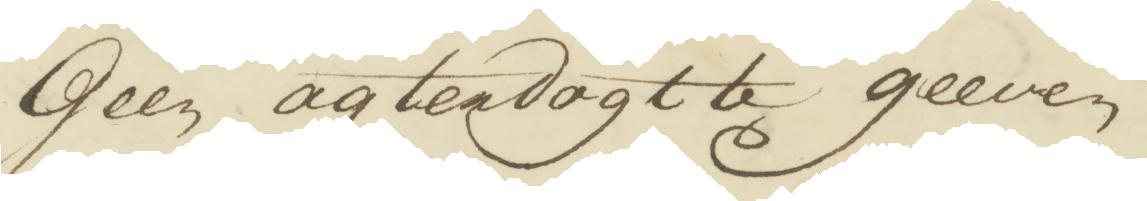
Geen agterdogt te geeven
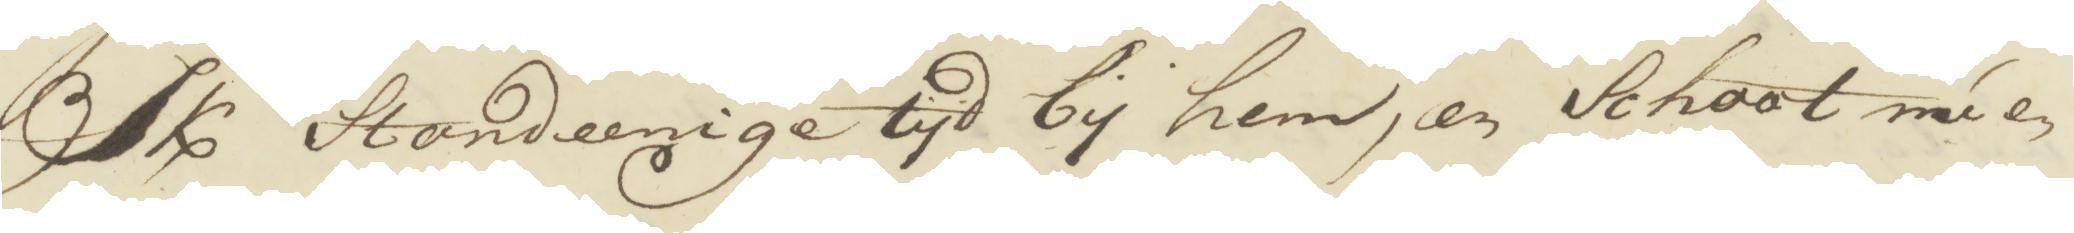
Ik stonde enige tijd bij hem, en schoot nu en
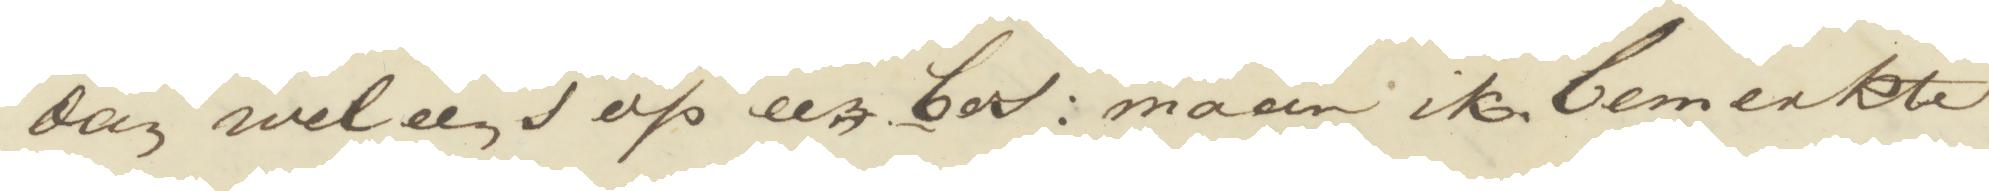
dan wel eens op een bes: maar ik bemerkte
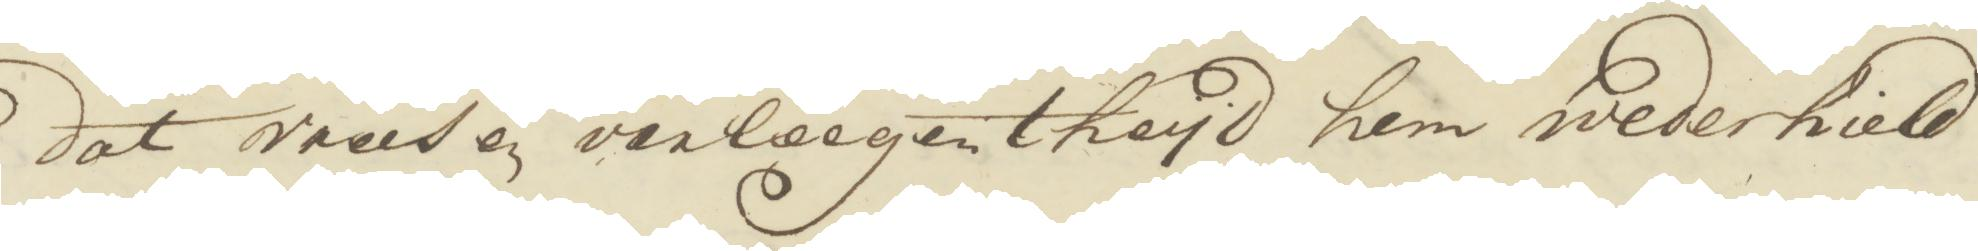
dat vrees en verleegentheijd hem wederhield
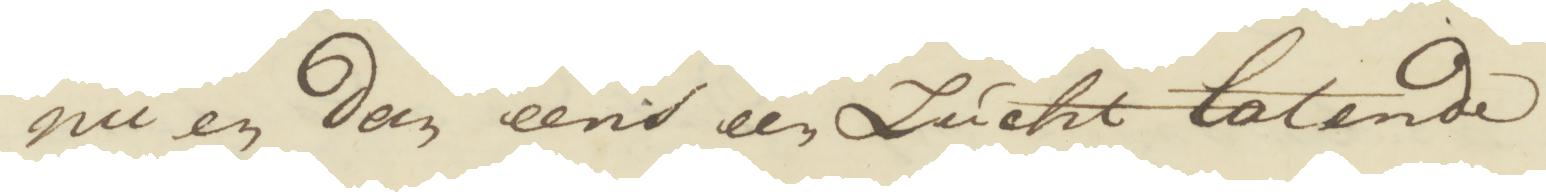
nu en dan eens een zucht latende
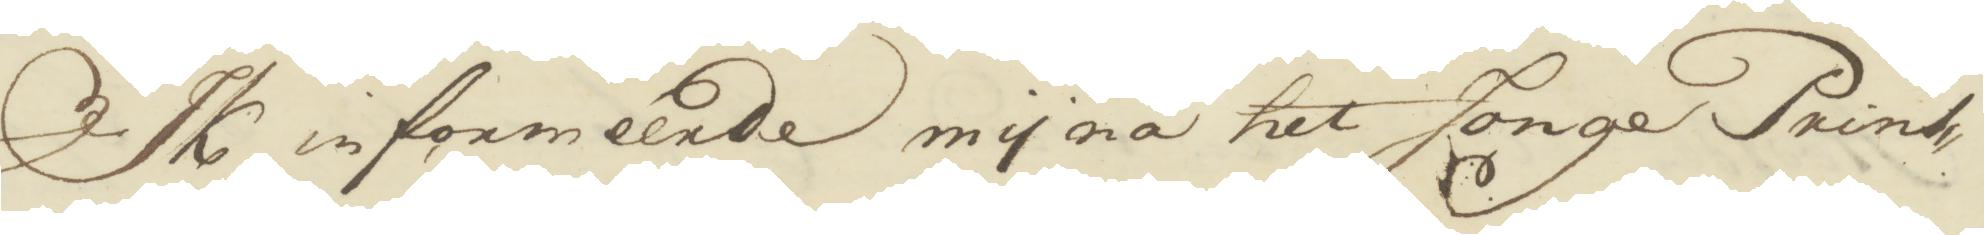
Ik informeerde mij na het Jonge Prins„
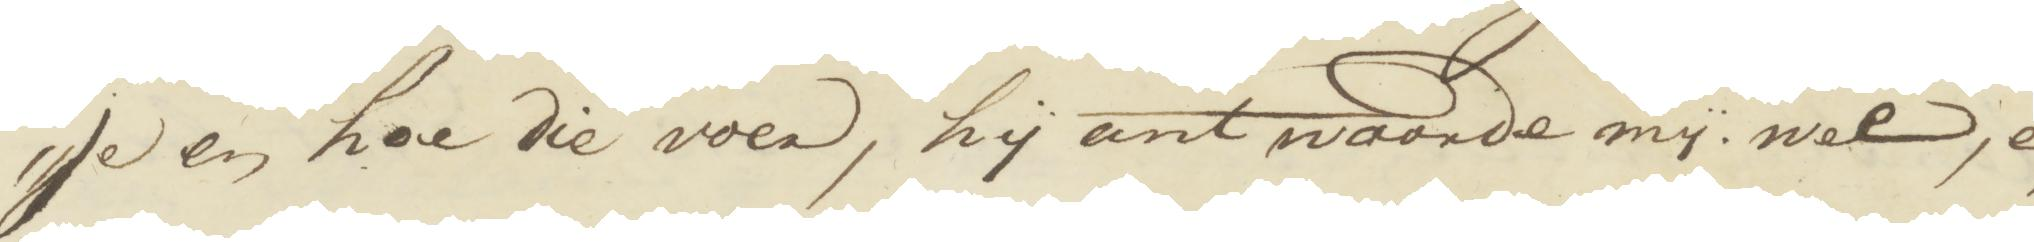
„je en hoe die voer, hij antwoorde mij. wel, en
